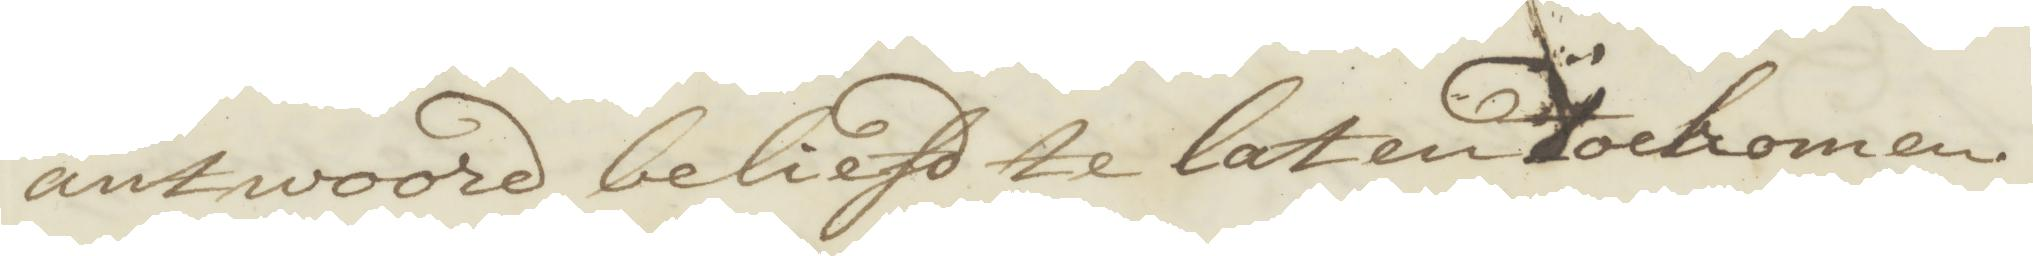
antwoord beliefd te laten toekomen
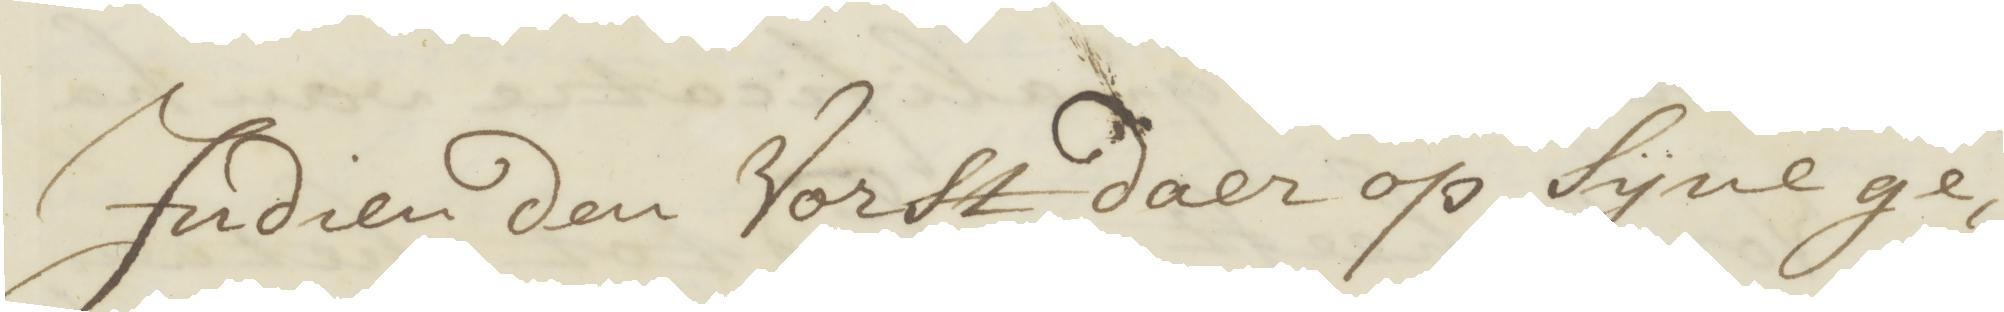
Jndien den vorst daer op sijne ge
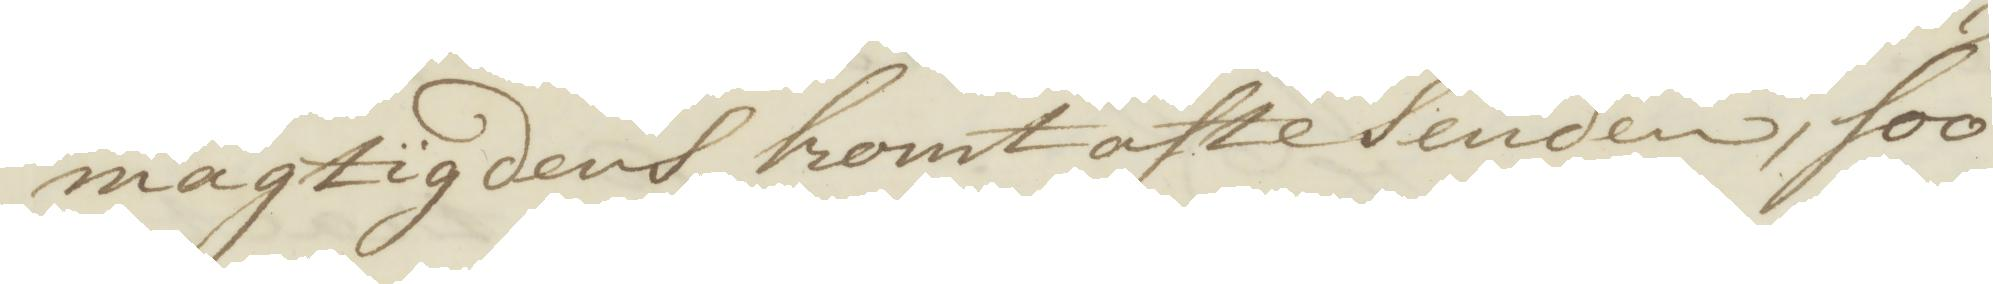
magtigdens komt afte senden, soo
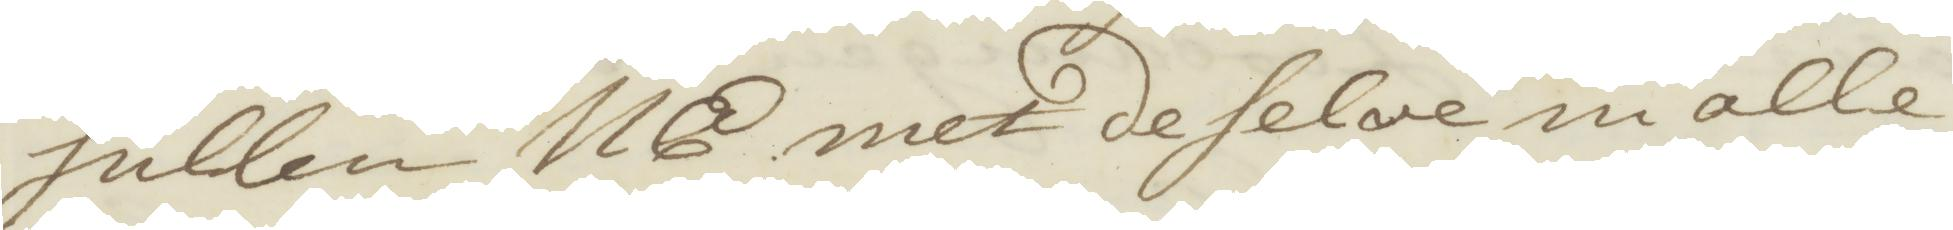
sullen UE met deselve in alle
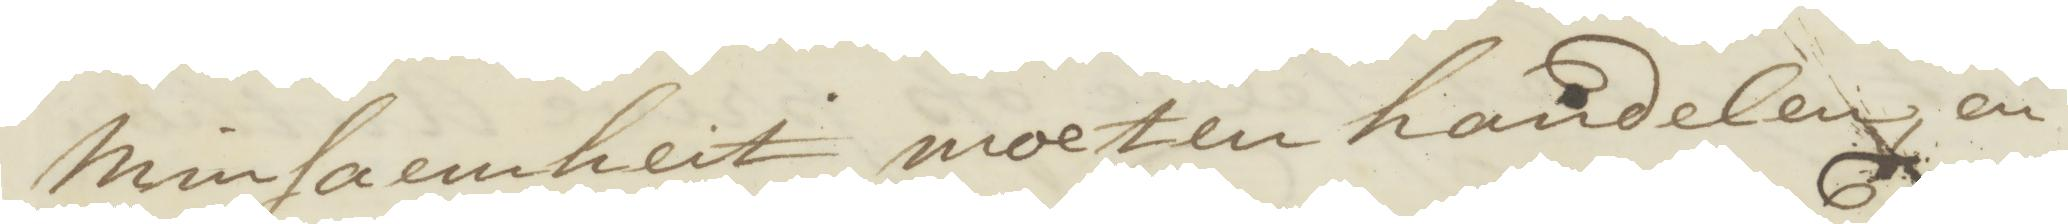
minsaemheit moeten handelen, en
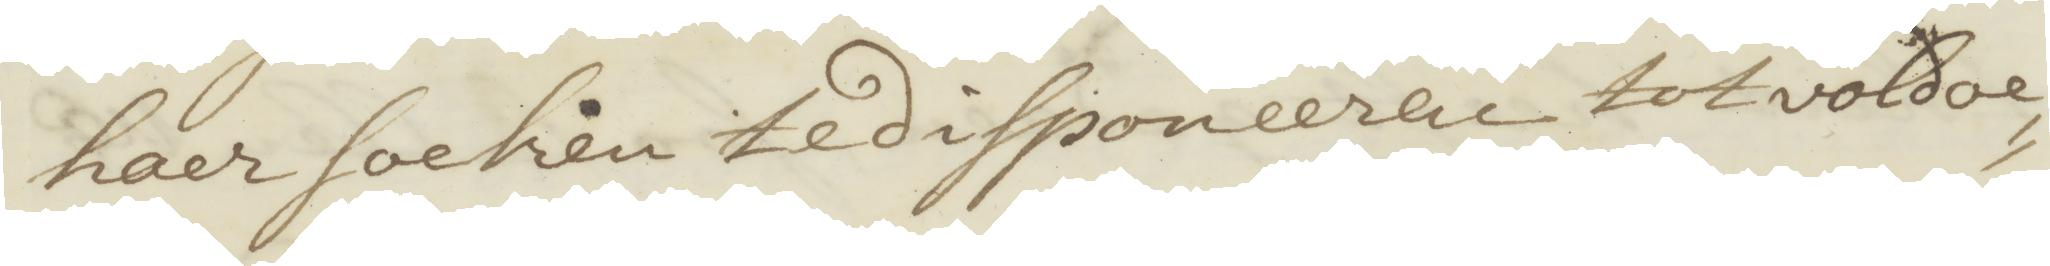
haer soeken te disponeeren tot voldoe„
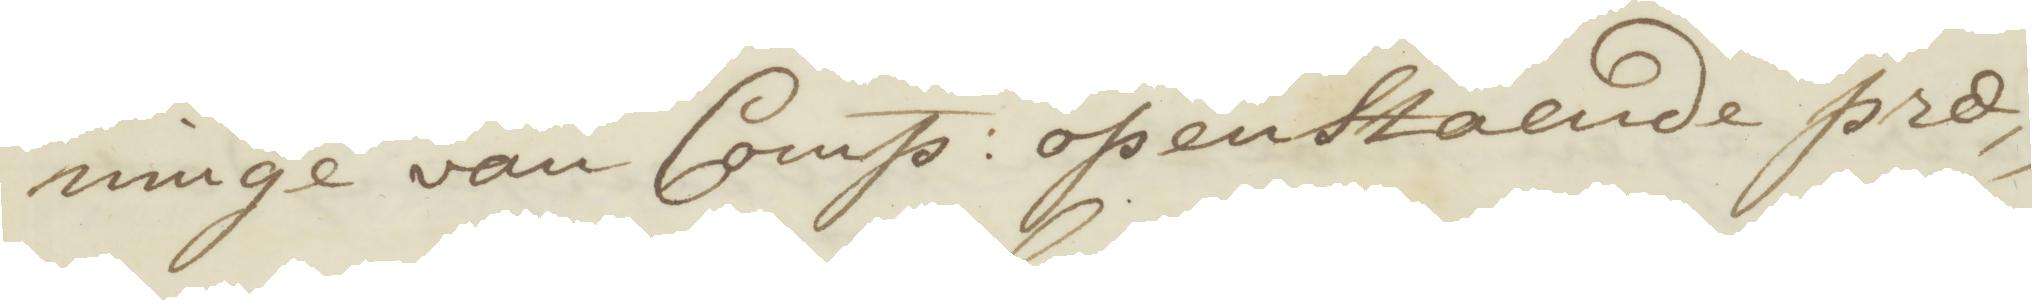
ninge van Comp: openstaende prae„
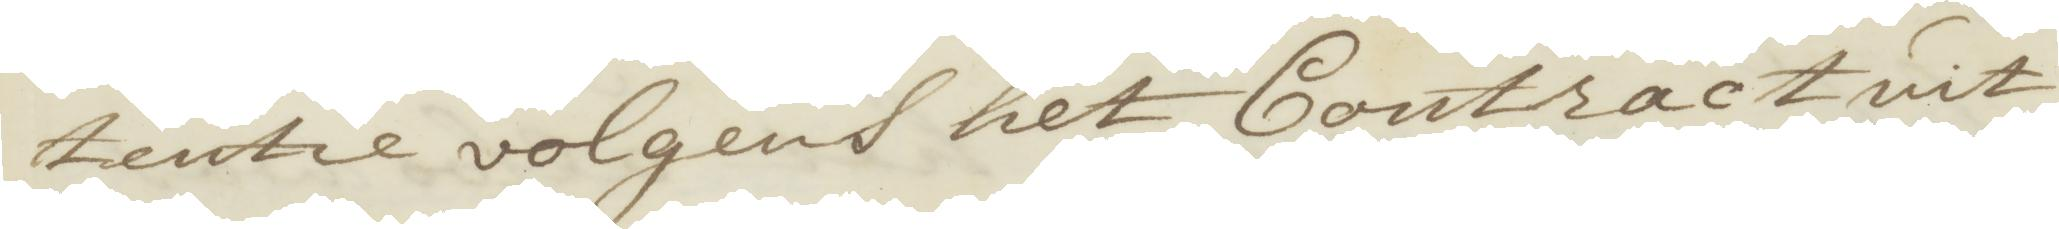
tentie volgens het Contract uit
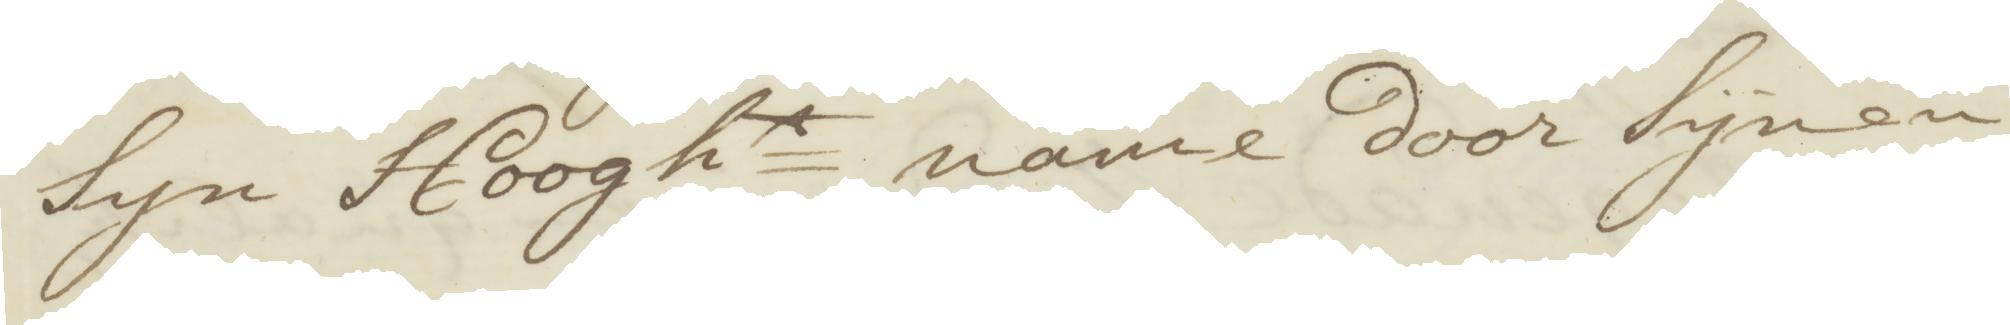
sijn Hoogh=t name door sijnen
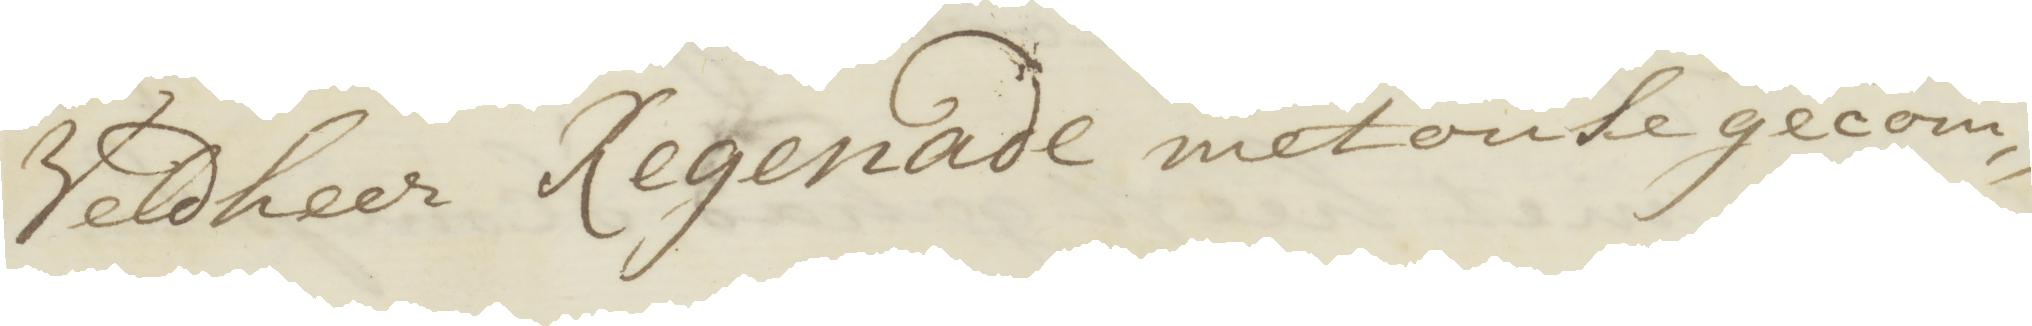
Veldheer Regenade met onse gecom„
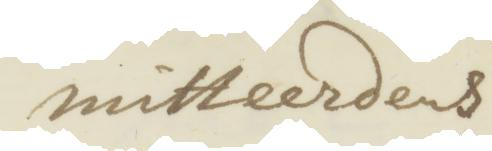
mitteerdens
